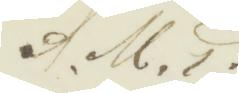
A M. T.
